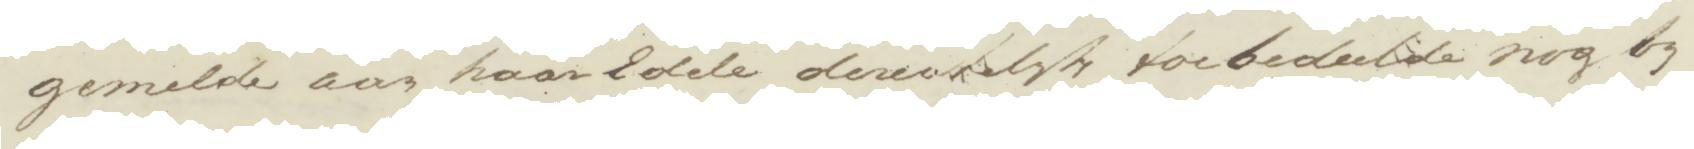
gemelde aan haar Edele de rechtelyk toebedeelde nog by
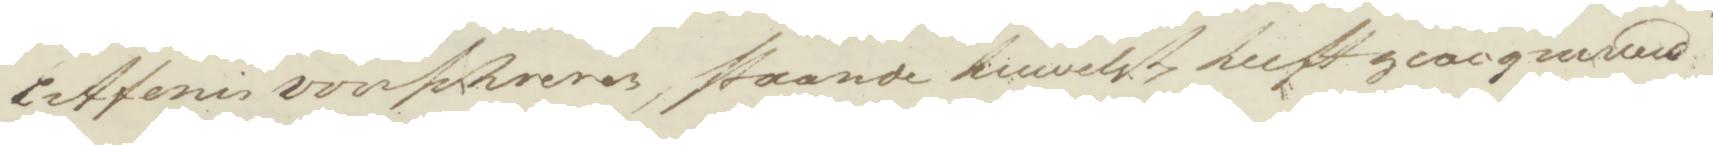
Erffenis voorschreven, staande huwelyk heeft geaccquireerd
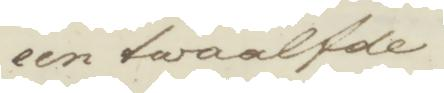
een twaalfde
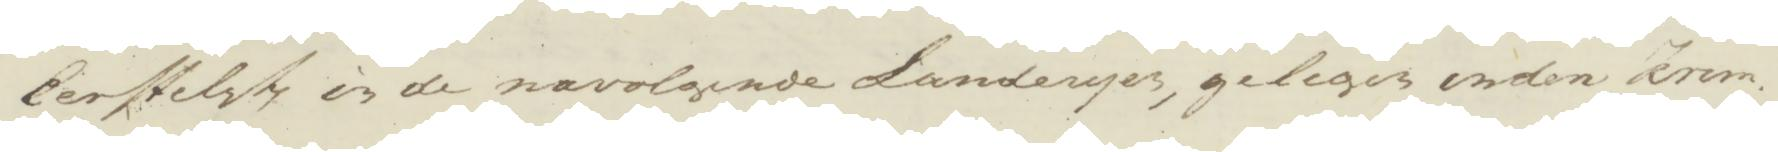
Eerstelyk in de navolgende Landeryen, gelegen in den Krim„
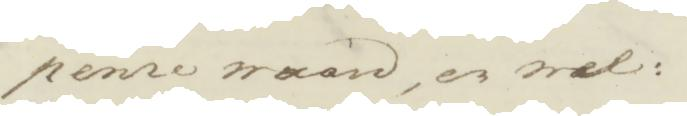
pener waard, en wel:
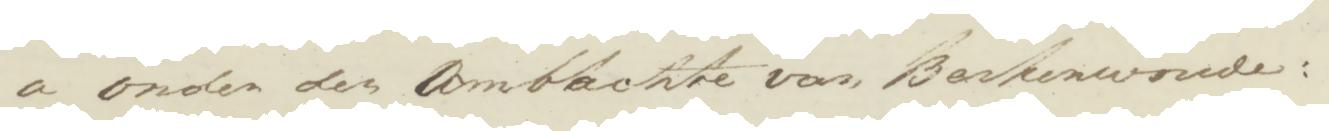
a onder den Ambachte van Berkenwoude;
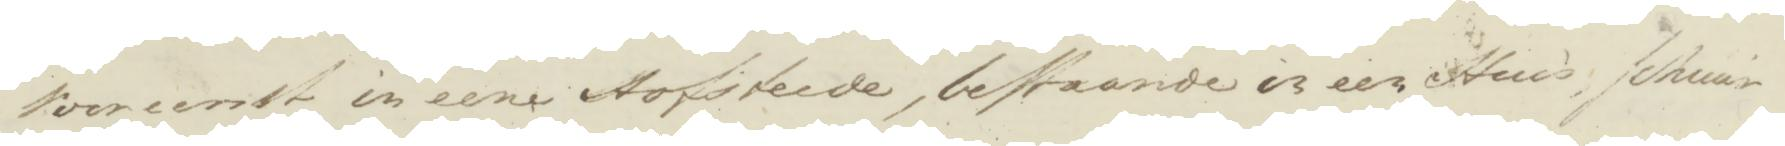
voor eerst in eene Hofsteede, bestaande in een Huis, Schuur
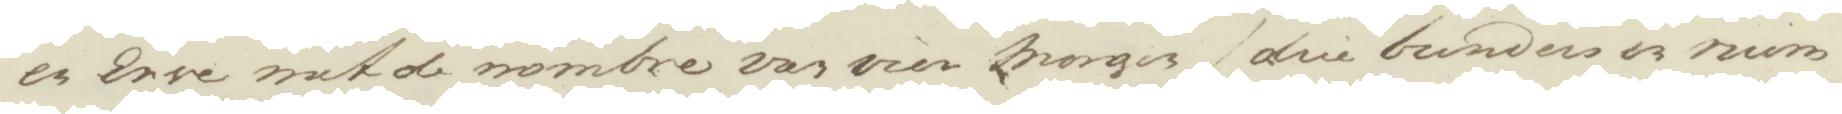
en Erve met de nombre van vier Morgen / drie bunders en ruim
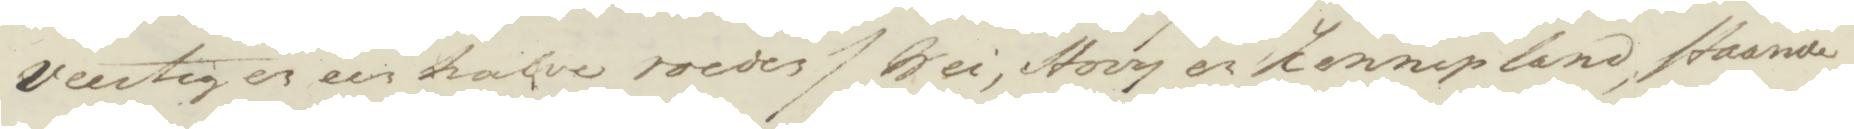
veertig en een halve roeden / Wei, Hooy en Hennipland, staande
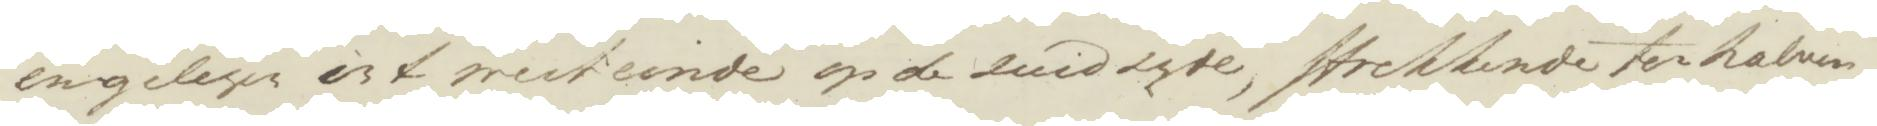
en gelegen in 't westeinde op de zuidzyde, strekkende ten halven
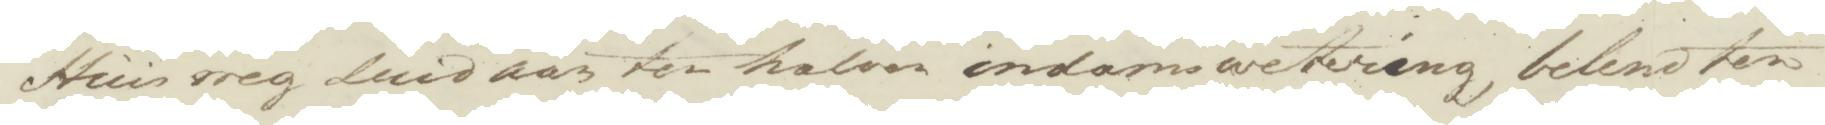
Huisweg Zuid aan ten halven indamswetering, belend ten
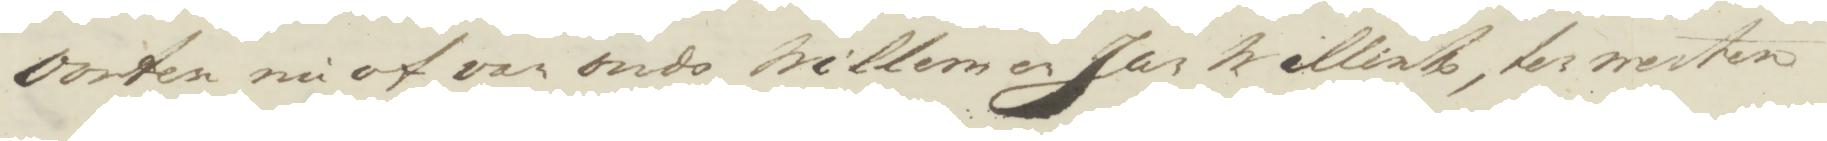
Oosten nu of van ouds Willem en Jan Willink, ten westen
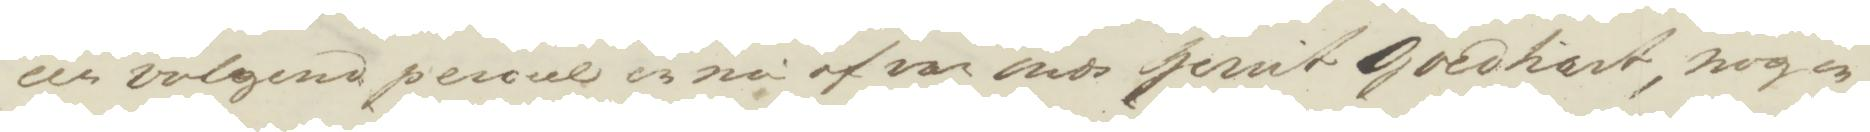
een volgend perceel en nu of van ouds Gerrit Goedhart, nog in
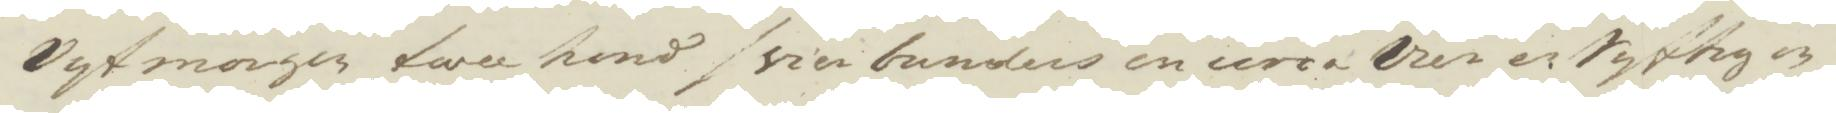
Vyf morgen twee hond / vier bunders en circa vier en Vyftig en
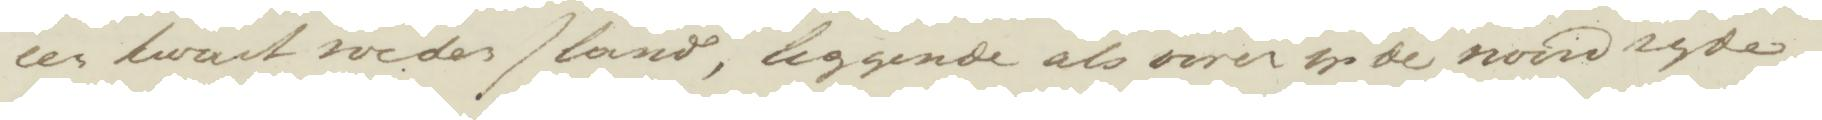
een kwart roeden / land, liggende als voren op de noordzyde,
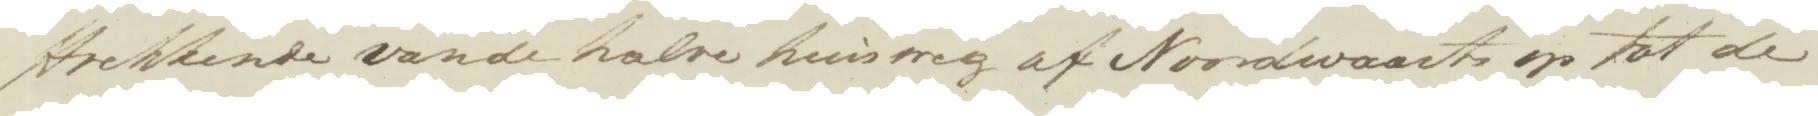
strekkende van de halve huisweg af Noordwaarts op tot de
